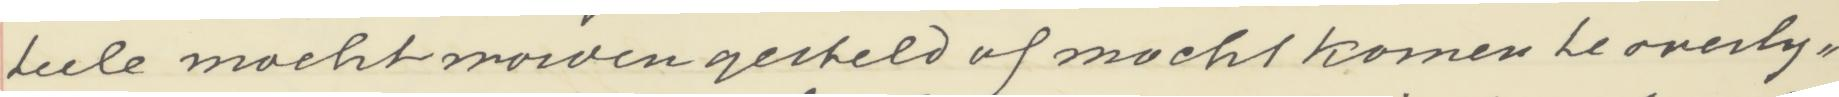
teele mocht worden gesteld of mocht komen te overly„
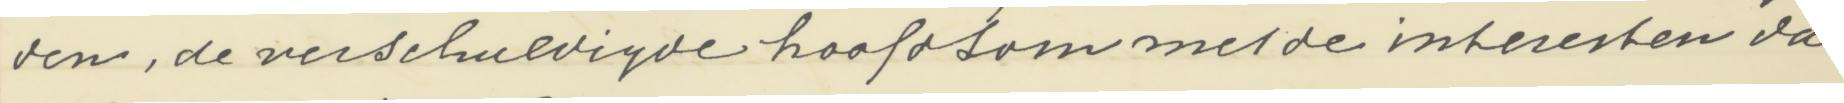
den, de verschuldigde hoofdsom met de interesten da
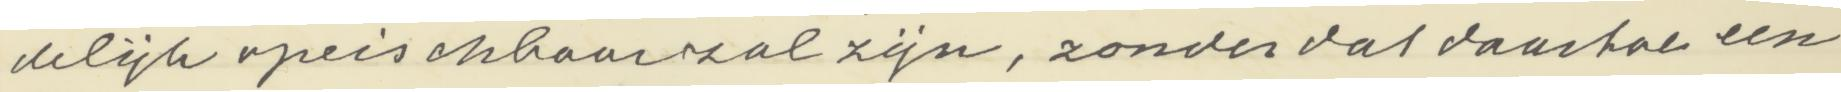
delijk opeischbaar zal zijn, zonder dat daartoe een
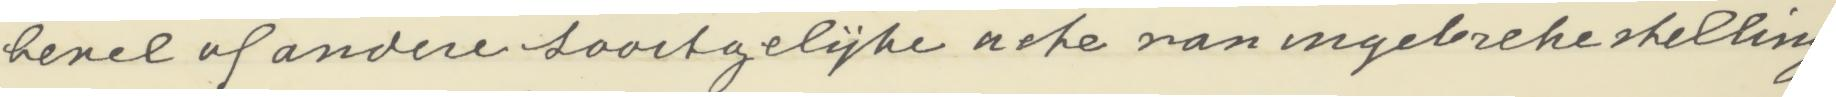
bevel of andere soortgelijke acte van ingebrekestelling
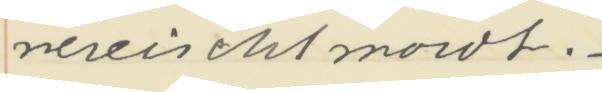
vereischt wordt.
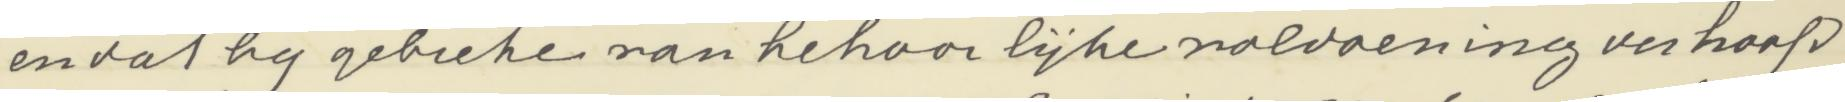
en dat by gebreke van behoorlijke voldoening van hoofd
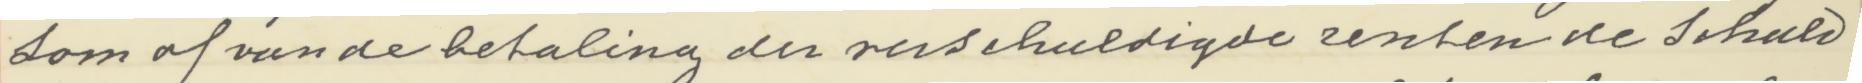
som of van de betaling der verschuldigde renten de schuld
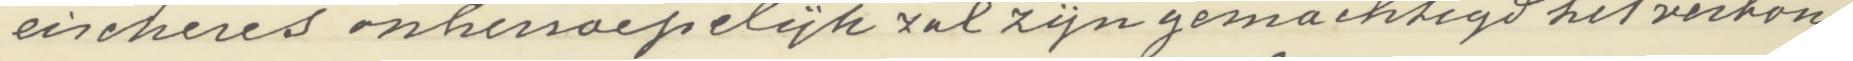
eischeres onherroepelijk zal zijn gemachtigd het verbon
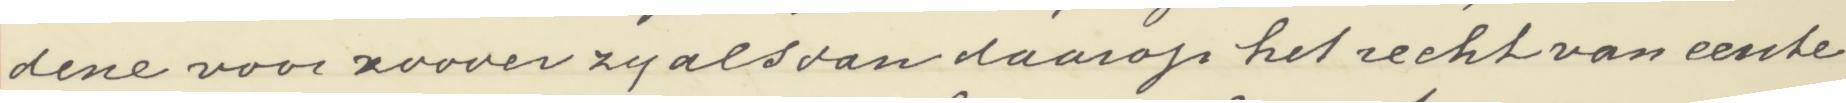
dene voor zoover zy als dan daarop het recht van eerste
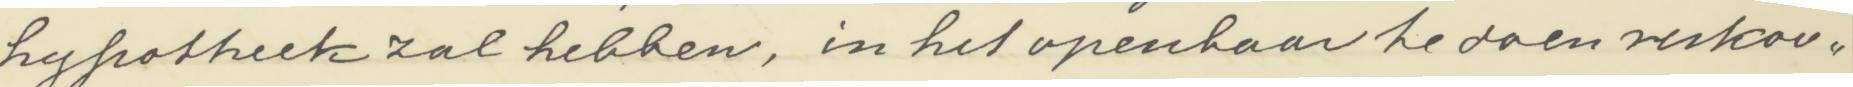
hypotheek zal hebben, in het openbaar te doen verkoo„
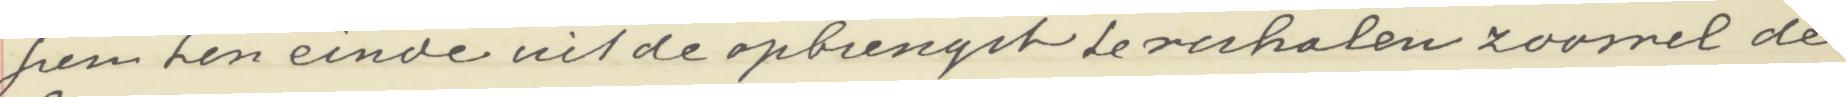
pen ten einde uit de opbrengst te verhalen zoowel de
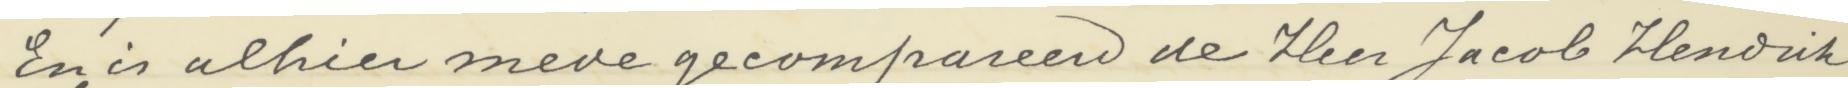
En is alhier mede gecompareerd de Heer Jacob Hendrik
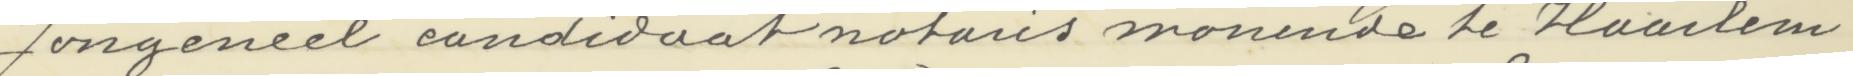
Jongeneel candidaat notaris wonende te Haarlem
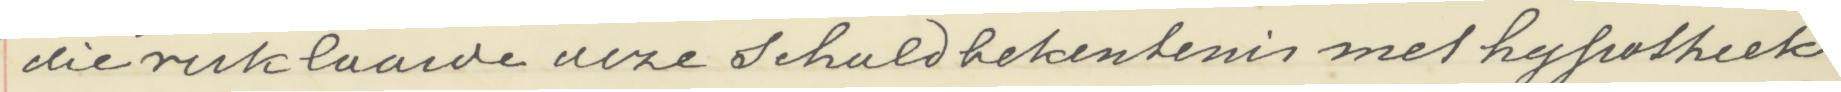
die verklaarde deze schuldbekentenis met hypotheek
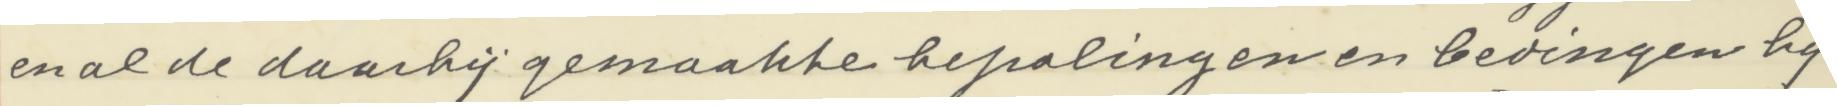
en al de daarbij gemaakte bepalingen en bedingen by
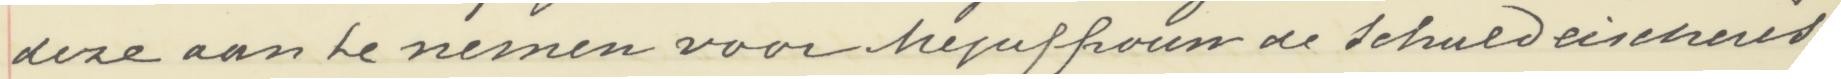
deze aan te nemen voor mejuffrouw de schuldeischeres.
